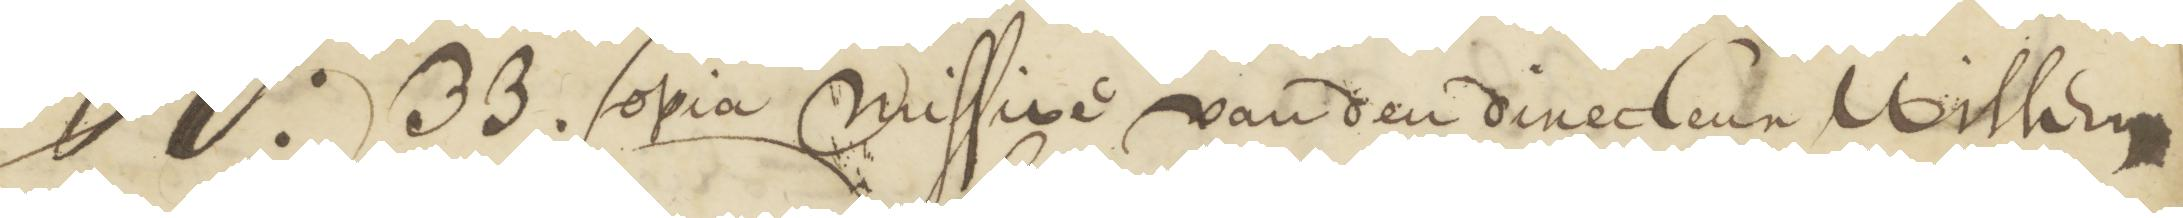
N:o 33. Copia missive van den directeur Willem
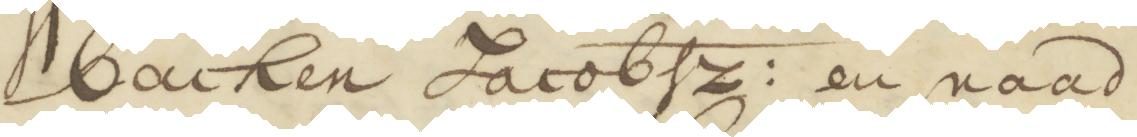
Backer Jacobsz: en raad
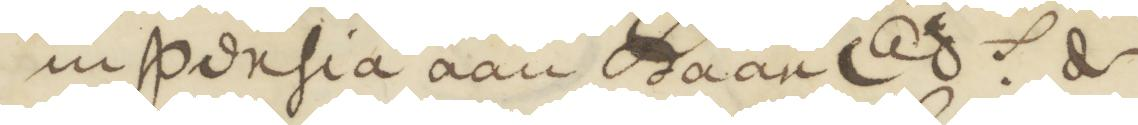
in Persia aan haar Ed:s de
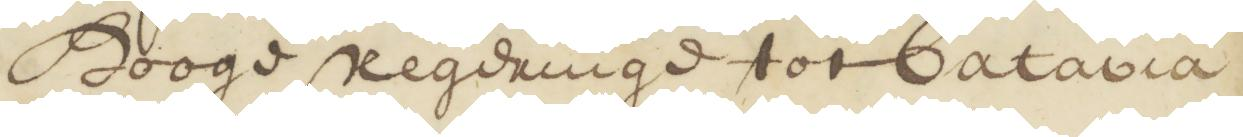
Hooge Regeringe tot Batavia
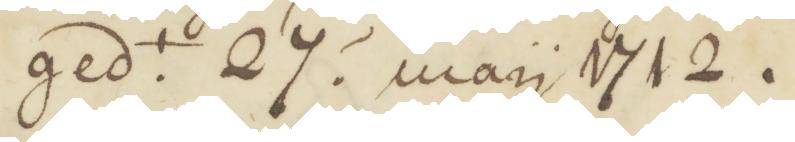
ged.t 27'. maij 1712.
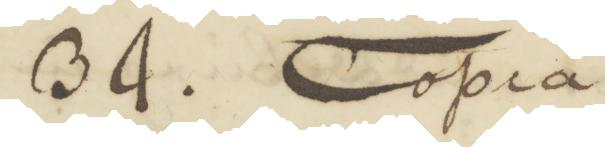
34. Copia
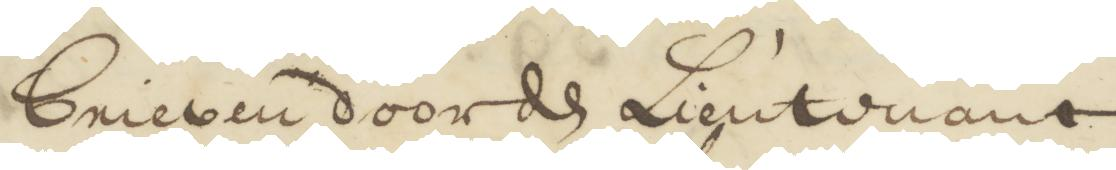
Brieven door den Lieutenant
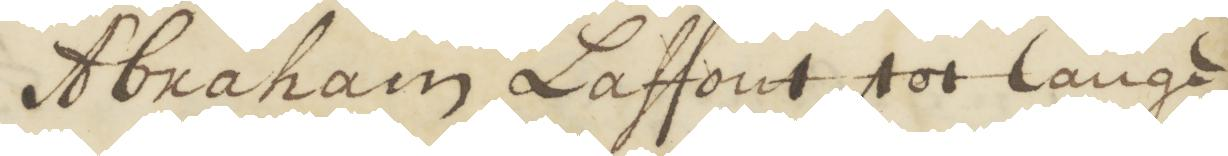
Abraham Laffont tot tange
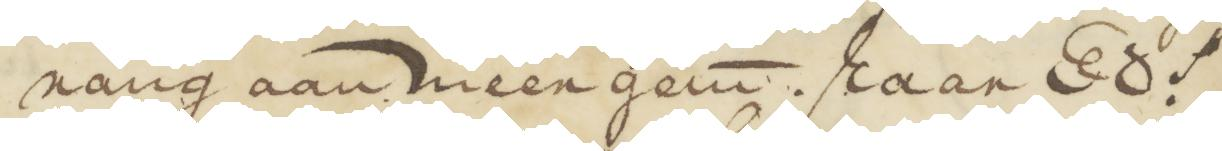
rang aan meer gem: haar Ed:s
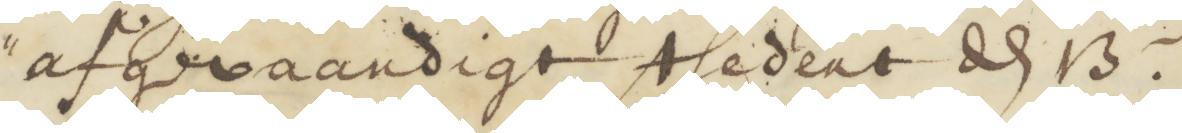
" afgevaandigt tsedert den 13:en
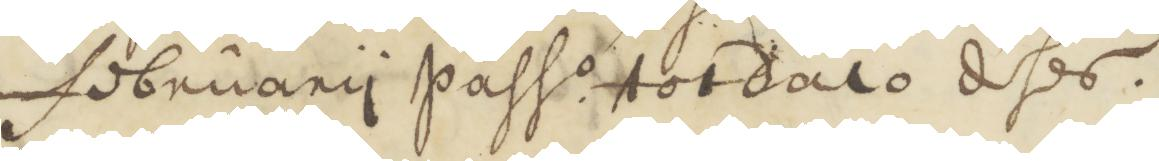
februarij pass.o tot dato deses.
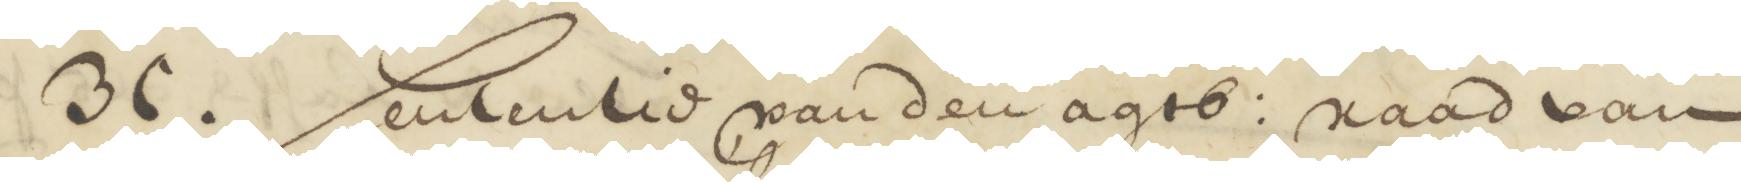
35. Sententie van den agtb: raad van
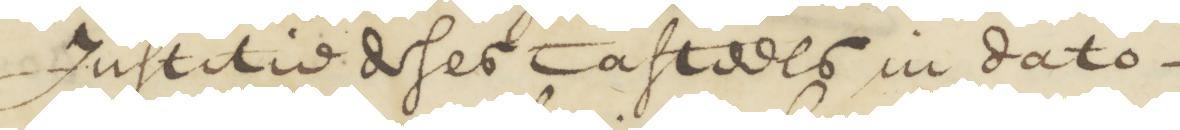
Justitie deses Casteels in dato
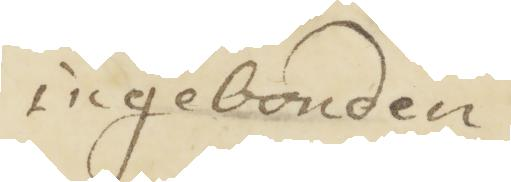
ingebonden
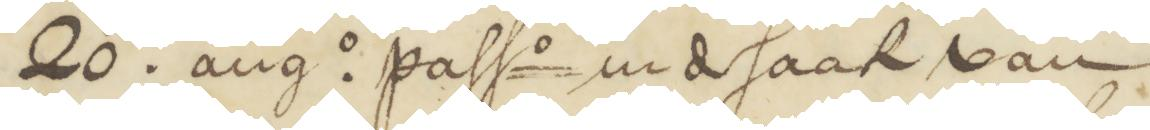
20.e aug.o pass=o in desaak van
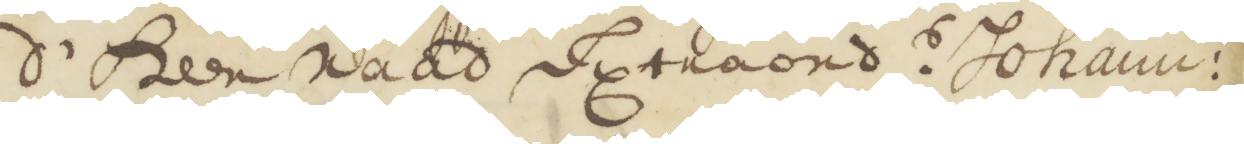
d’ Heer raad Extraord.s Johann:s
